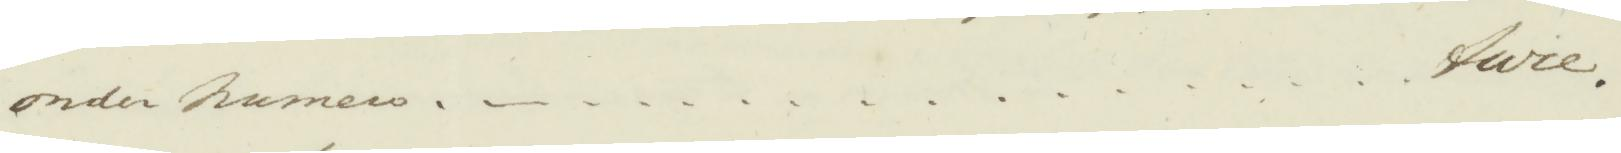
onder numero . . . . . . . . . . . . . . . . . . ture.
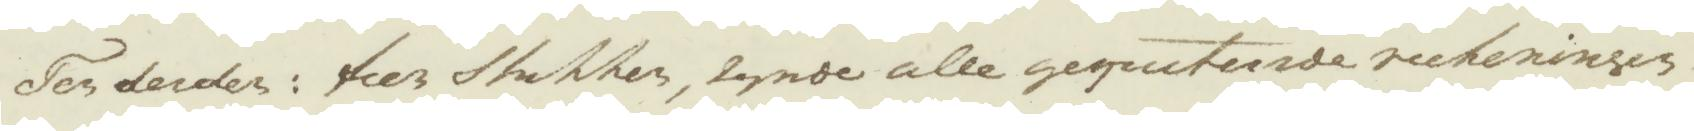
Ten derden: tien stukken, zynde alle gequiteerde reekeningen
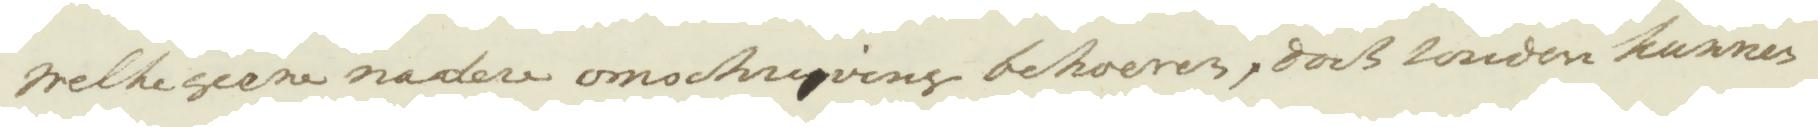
welke geene nadere omschryving behoeven, doch zouden kunnen
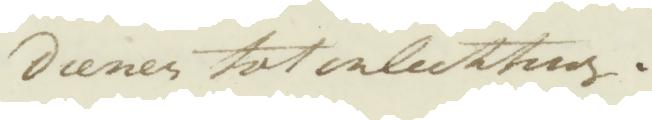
dienen tot inlichting.
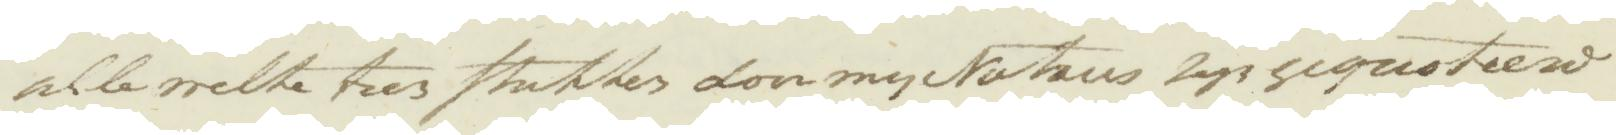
alle welke tien stukken door my Notaris zyn gequoteerd
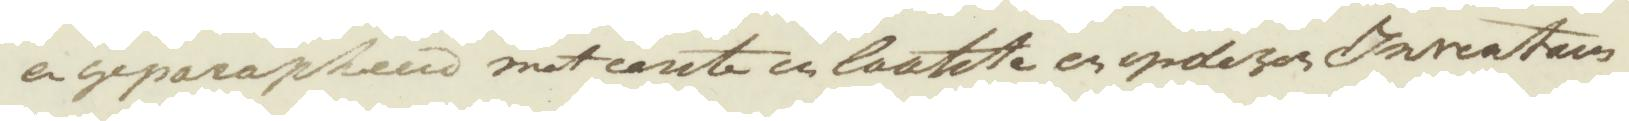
en geparapheerd met eerste en laatste en op dezen Inventaris
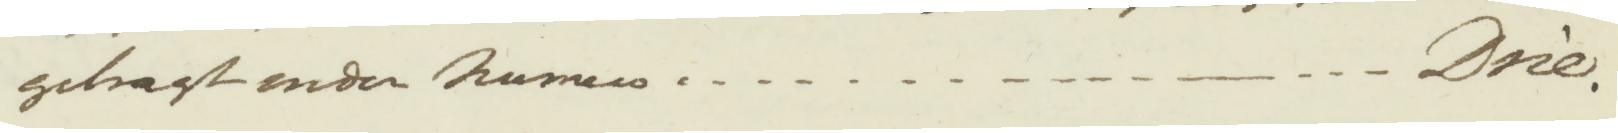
gebragt onder numero . - - - - - - - - - - - - - - Drie.
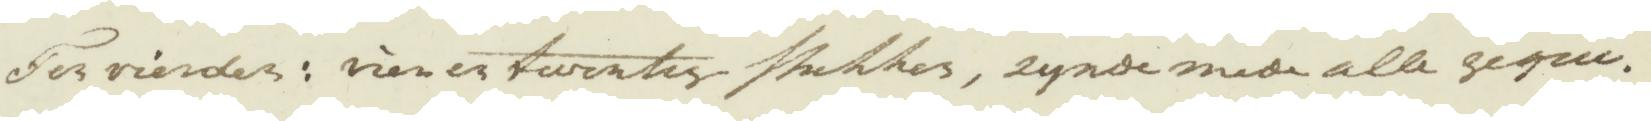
Ten vierden: vier en twintig stukken, zynde mede alle gequi.
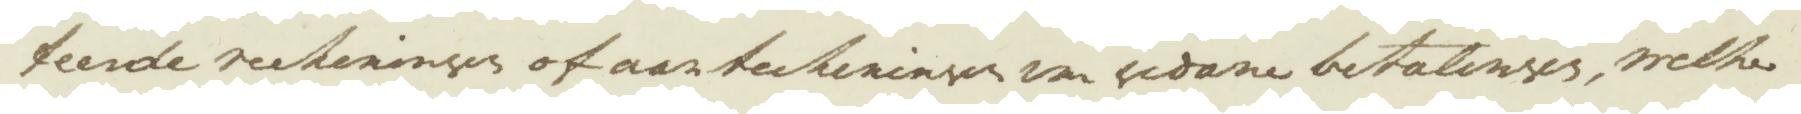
teerde reekeningen of aanteekeningen van gedane betalingen, welke
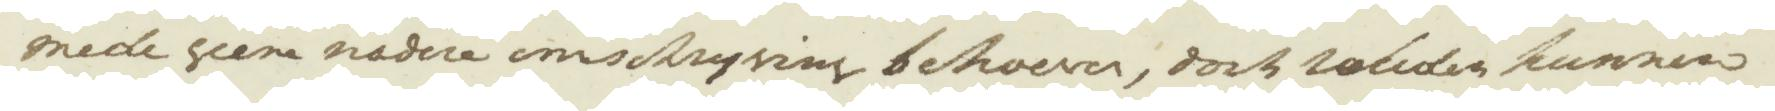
mede geene nadere omschrijving behoeven, doch zouden kunnen
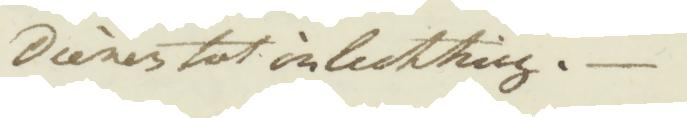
dienen tot inlichting. —
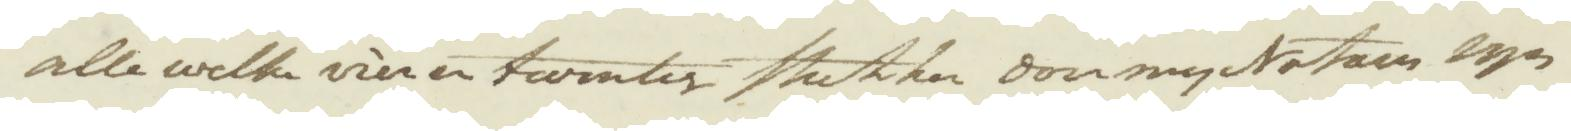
alle welke vier en twintig stukken door my Notaris zyn
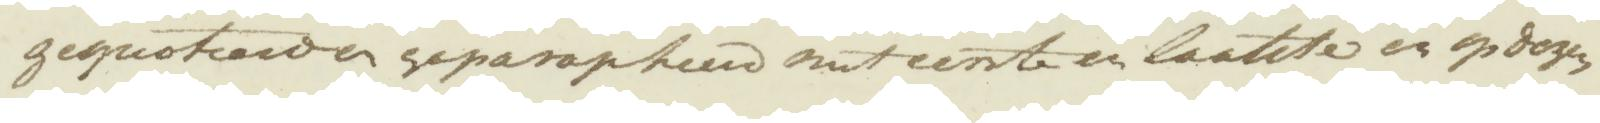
gequoteerd en geparapheerd met eerste en laatste en op dezen
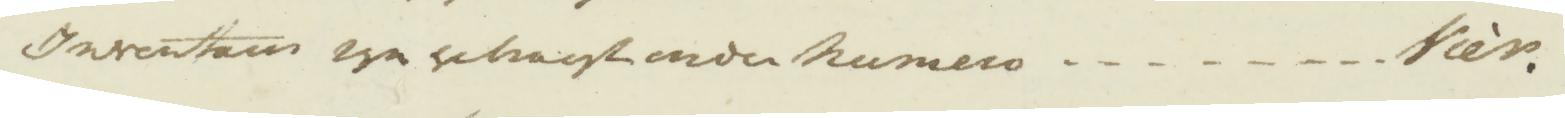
Inventaris zyn gebragt onder Numero - - - - - - - - Vier.
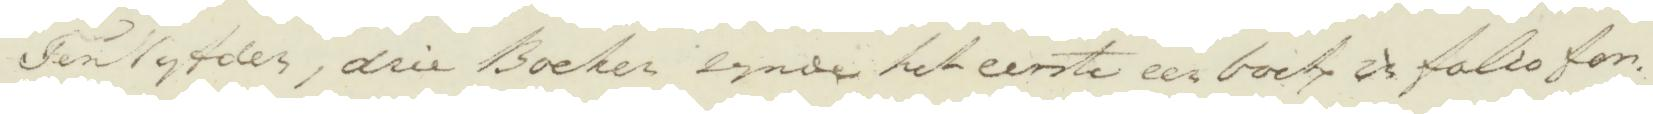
Ten Vyfden, drie Boeken zynde het eerste een boek in folio for
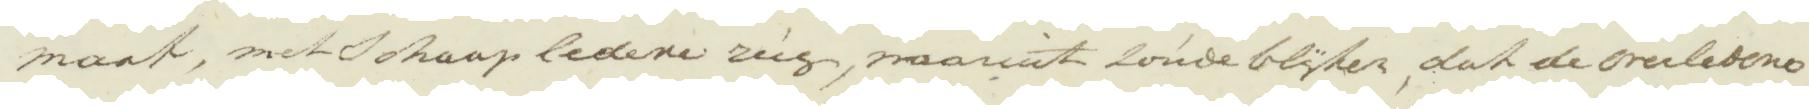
maat, met schaap ledere rug, waaruit zoude blijken, dat de overledene
